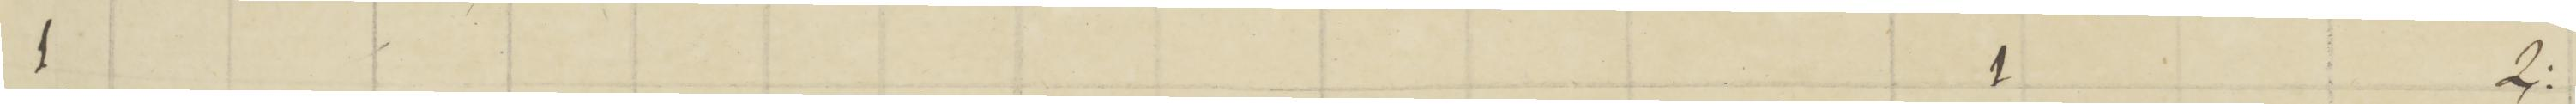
1 1 2:
